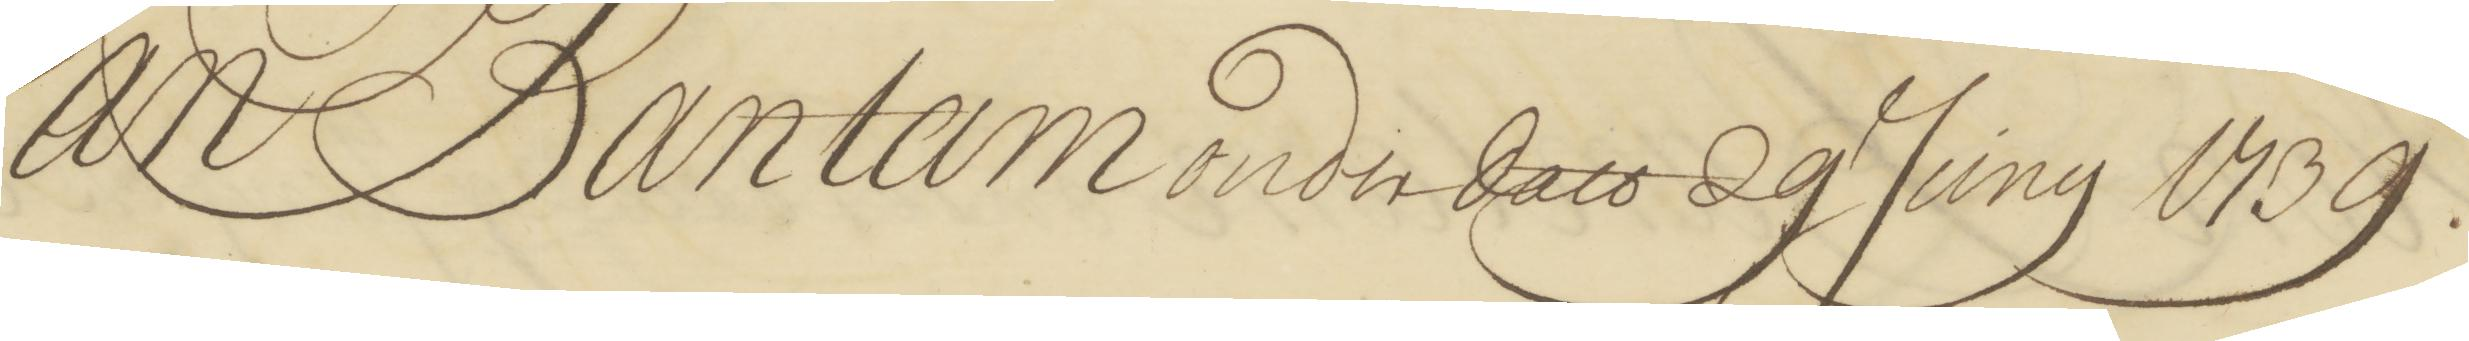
Van Bantam onder dato 29 Juny 1739
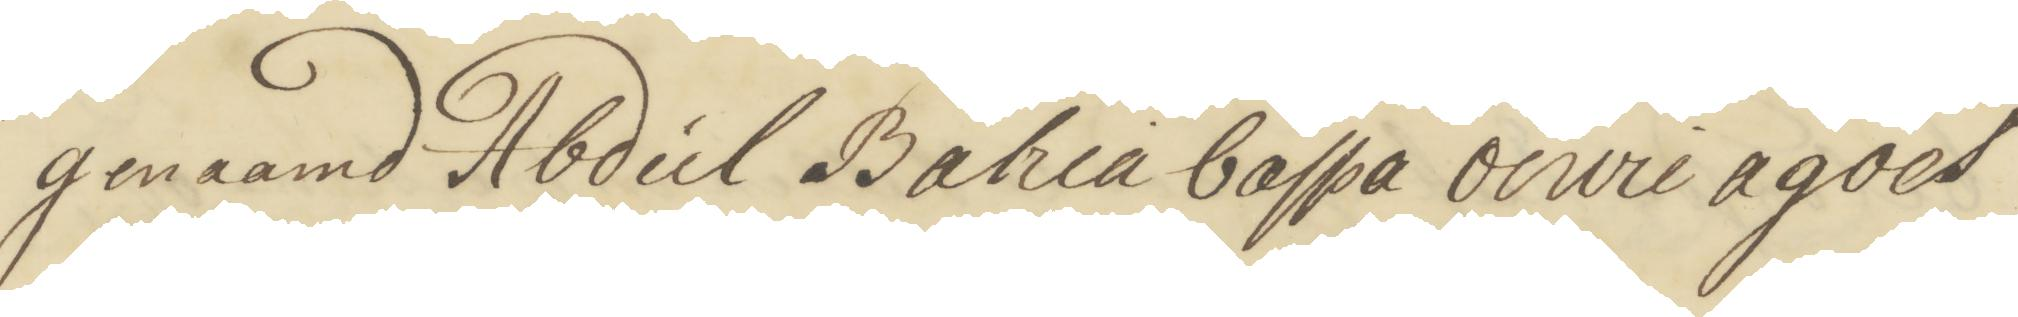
genaamd Abdul Bahia baspa oewie agoes
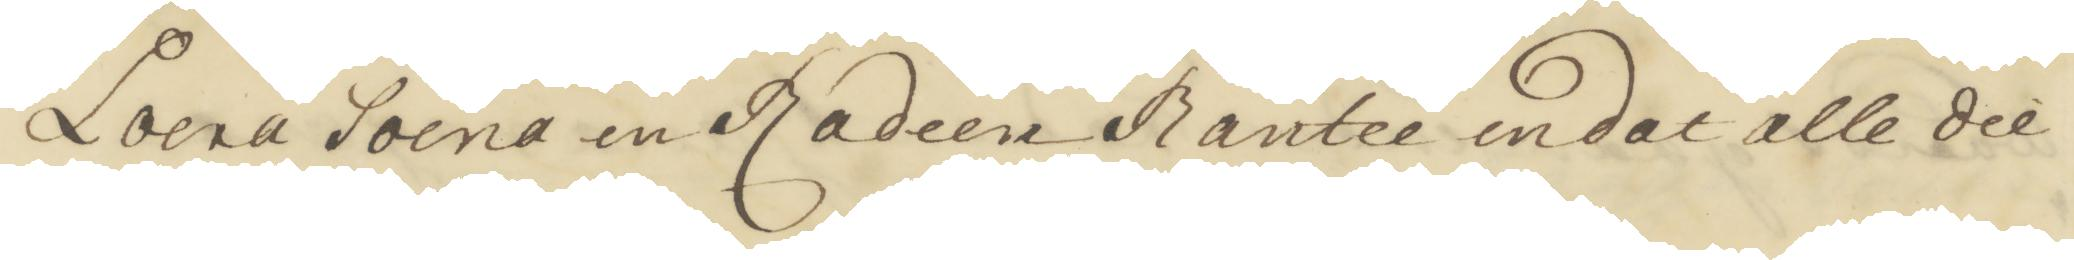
Loera soena en Radeer Rantee en dat alle die
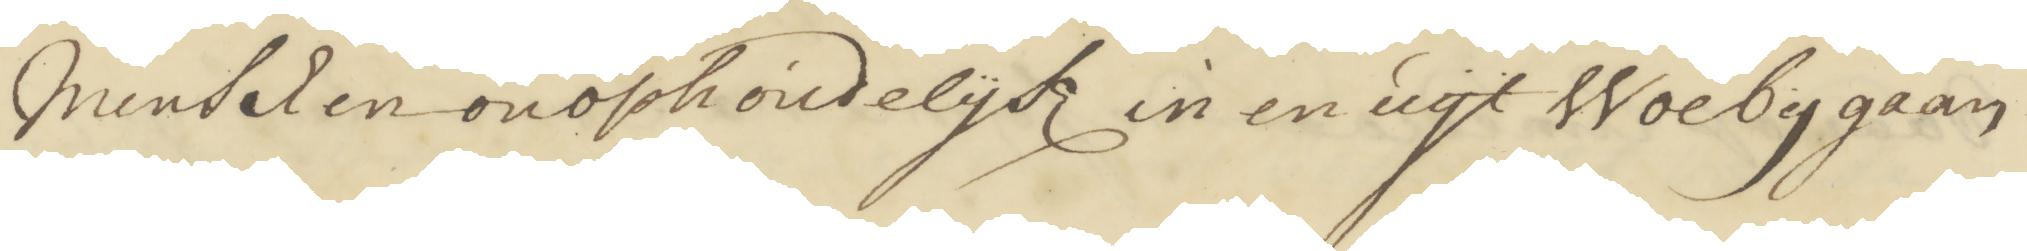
menschen onophoudelijk in en uijt Woebij gaan
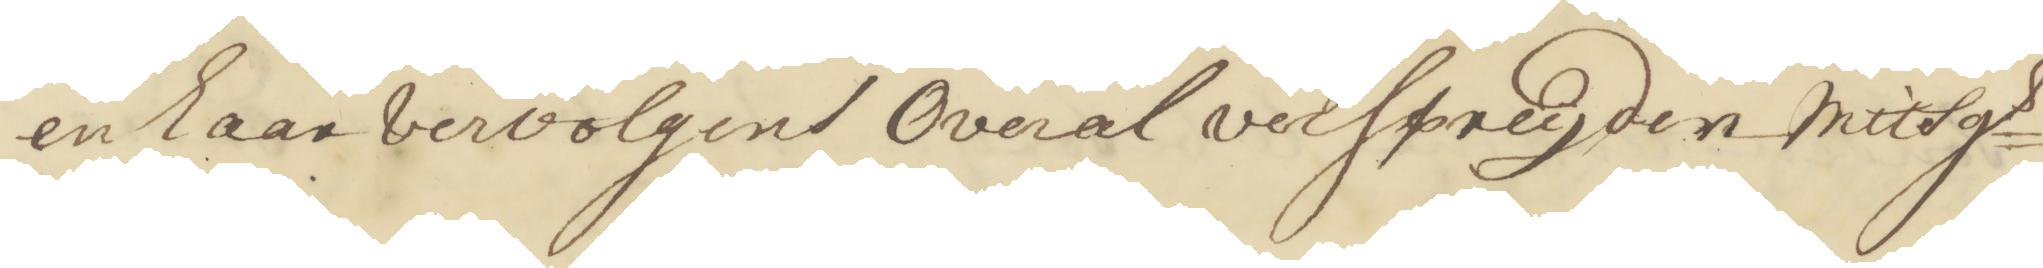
en haar vervolgens Overal verspreijden mitsg=s
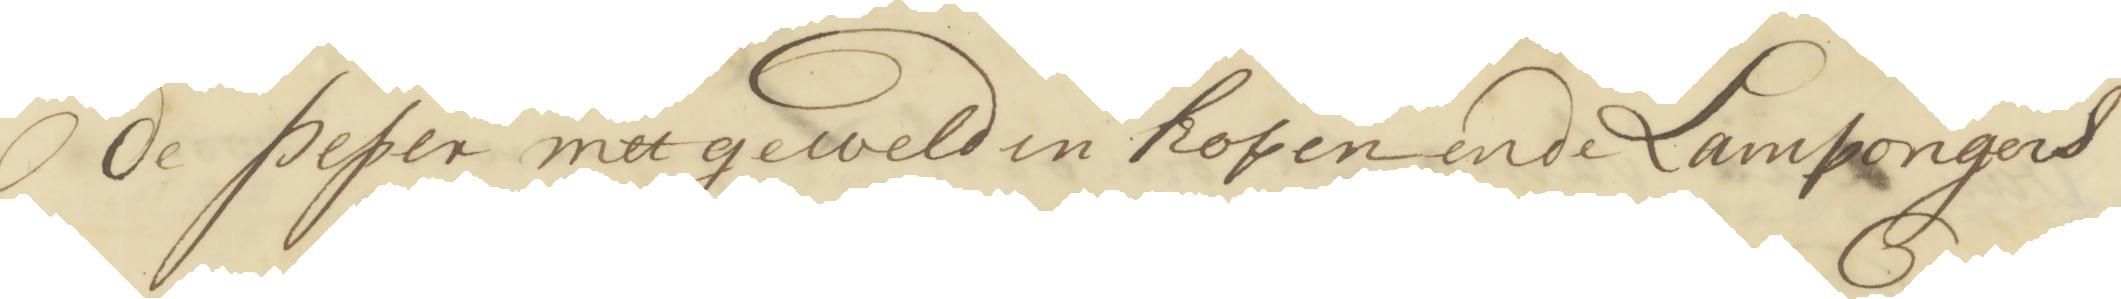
de peper met geweld in kopen ende Lampongers
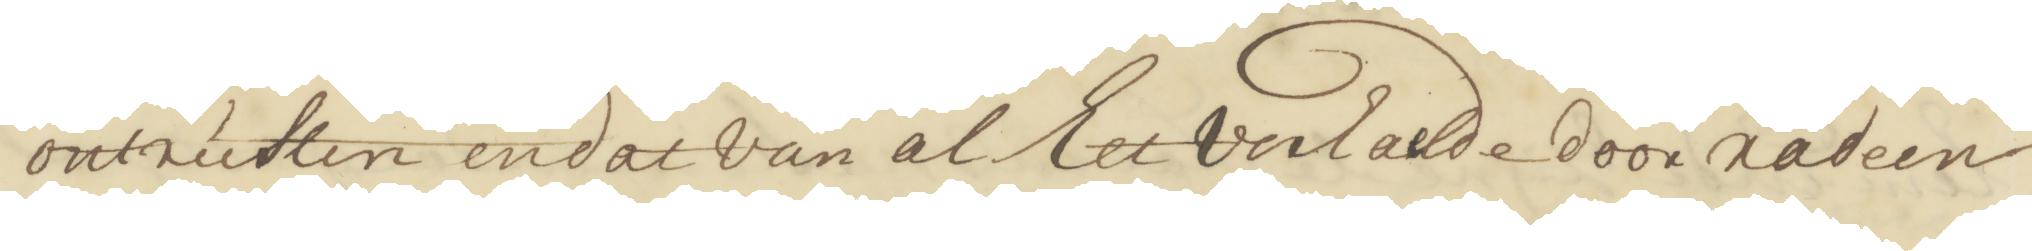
ontrusten en dat van al het verhaelde door radeen
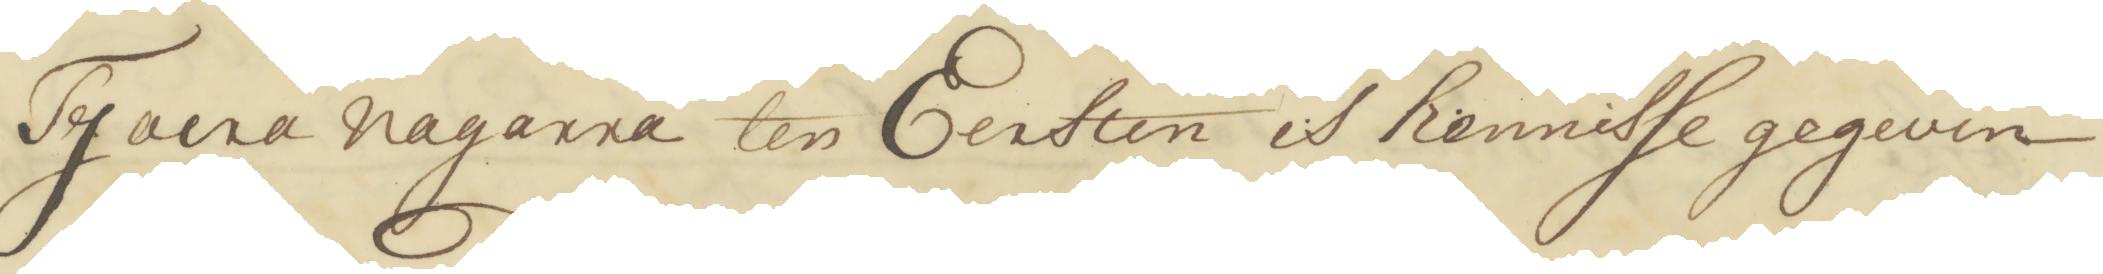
TJaera nagarra ten Eersten is kennisse gegeven
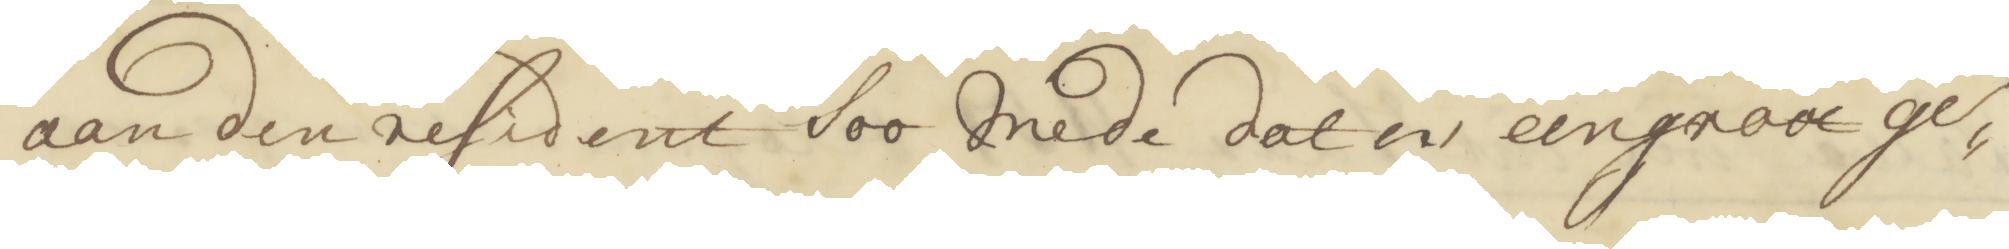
aan den resident soo mede dat er een groot ge„
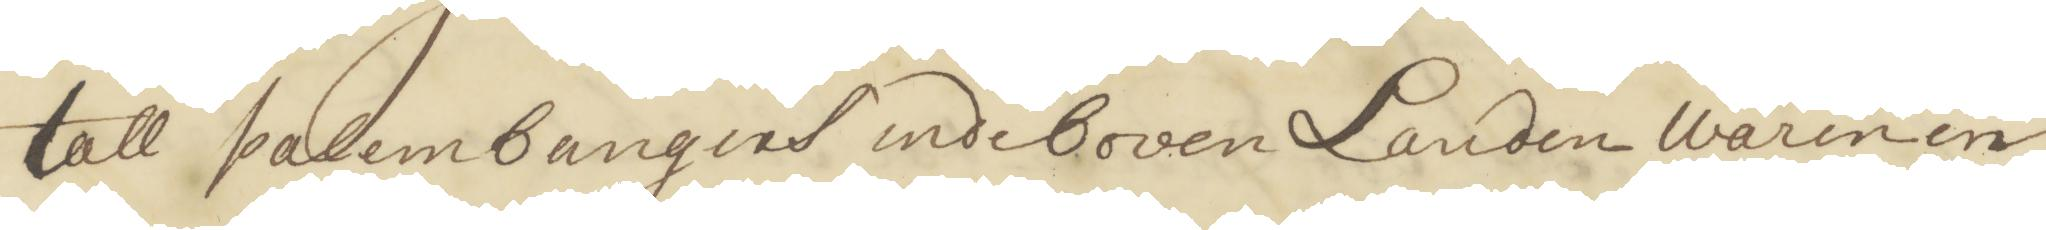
tall palembangers in de boven Landen waren en
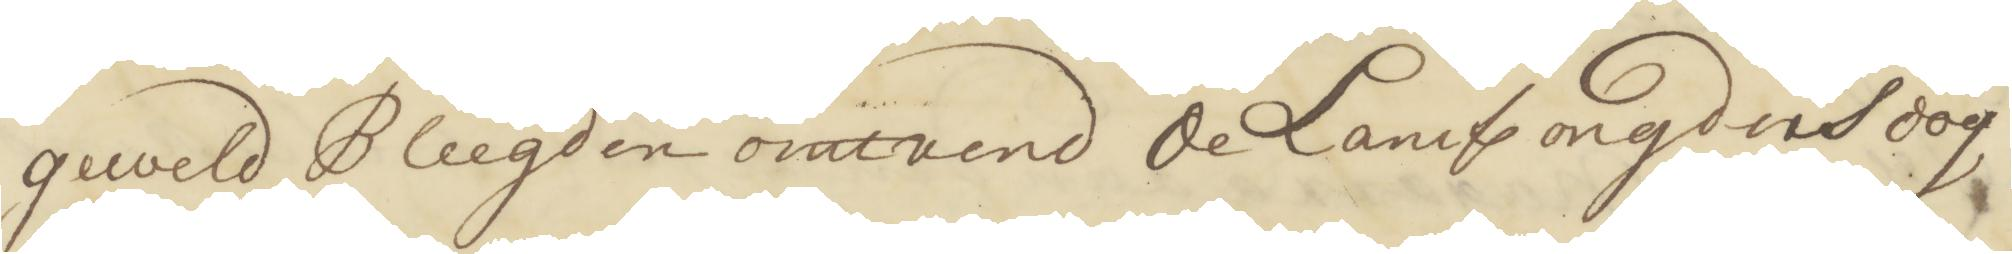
geweld Pleegden omtrend de Lampongders dog
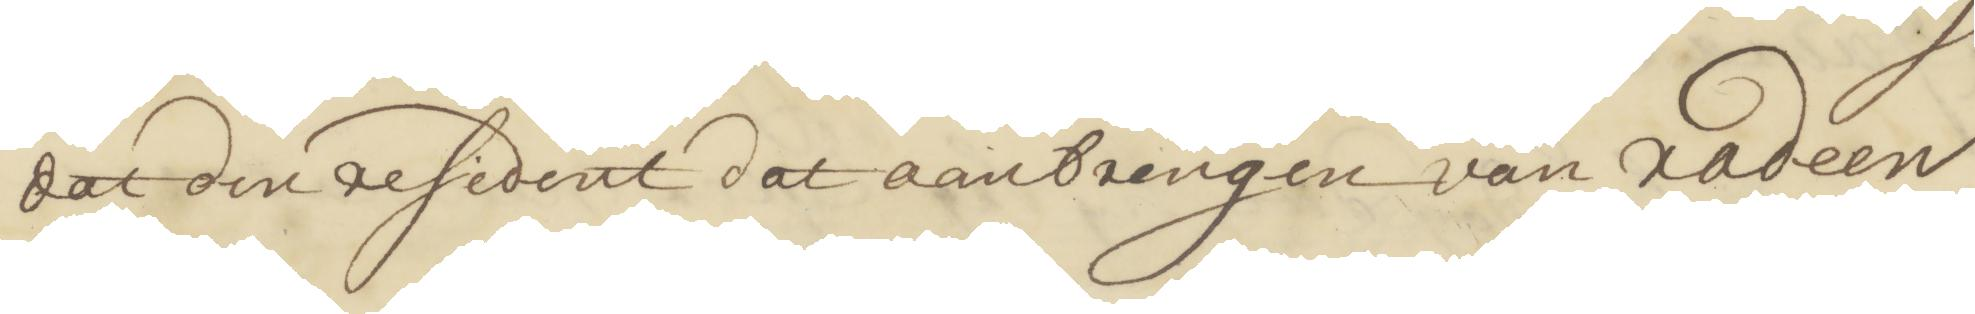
dat den resident dat aanbrengen van radeen
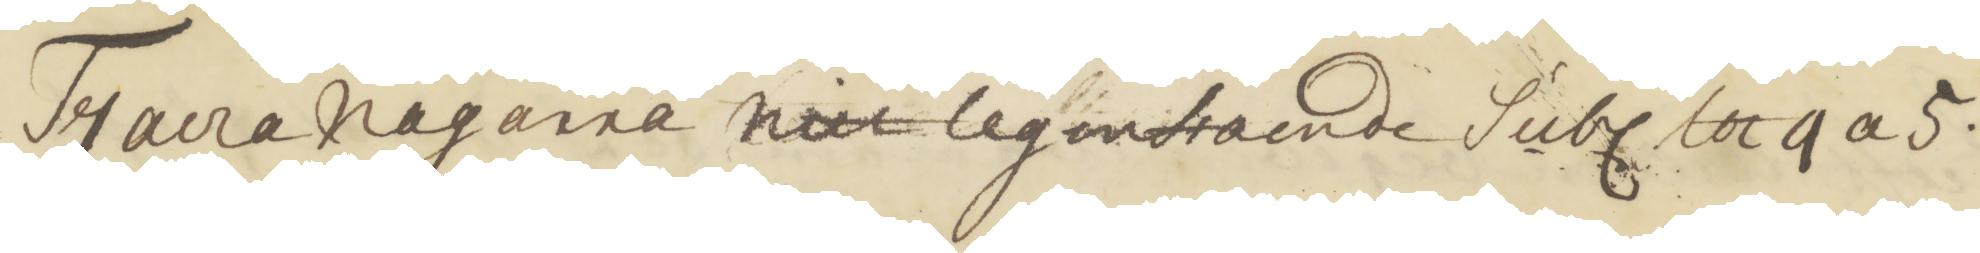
TJaira nagarra niet tegenstaende sulx tot 4 a 5
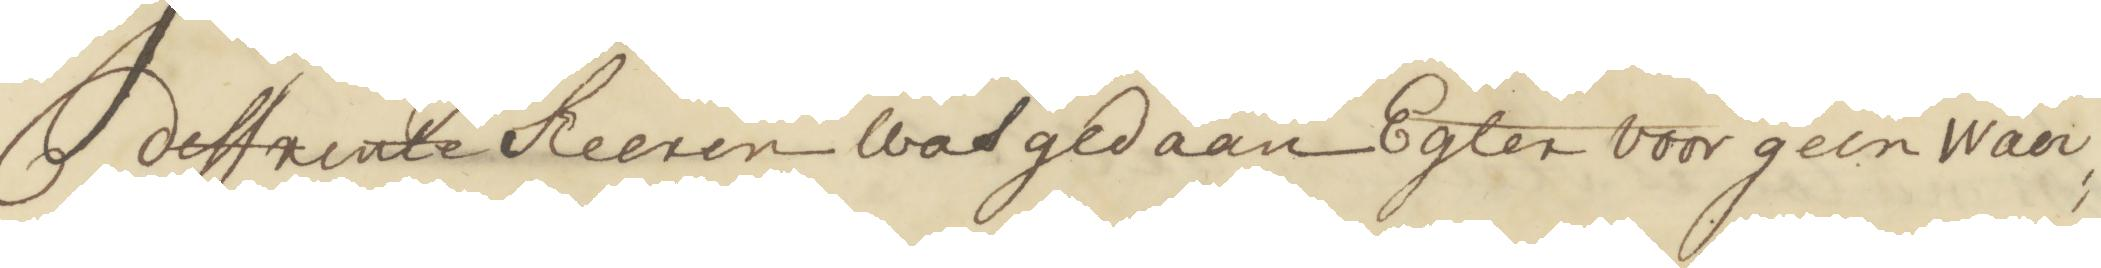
deffrente keeren was gedaan Egter voor geen waer
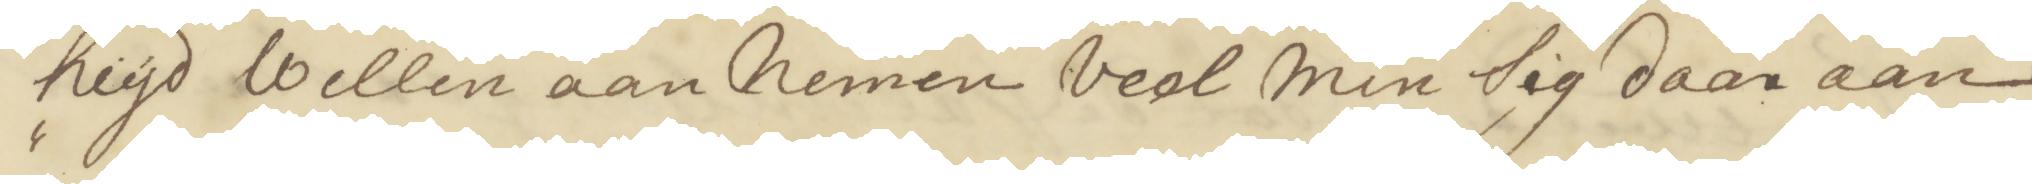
„heijd willen aan Nemen veel min sig daar aan
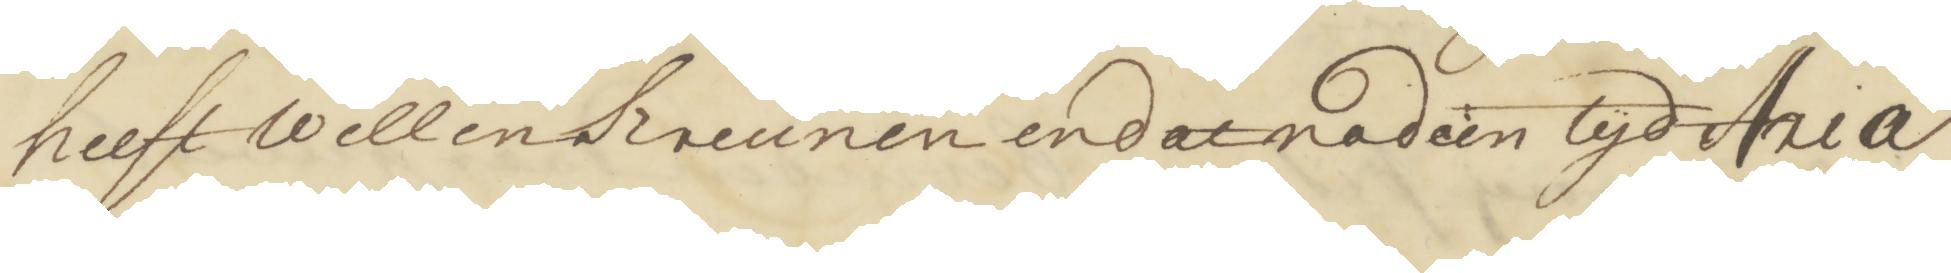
heeft willen kreunen en dat nadien tijd Aria
